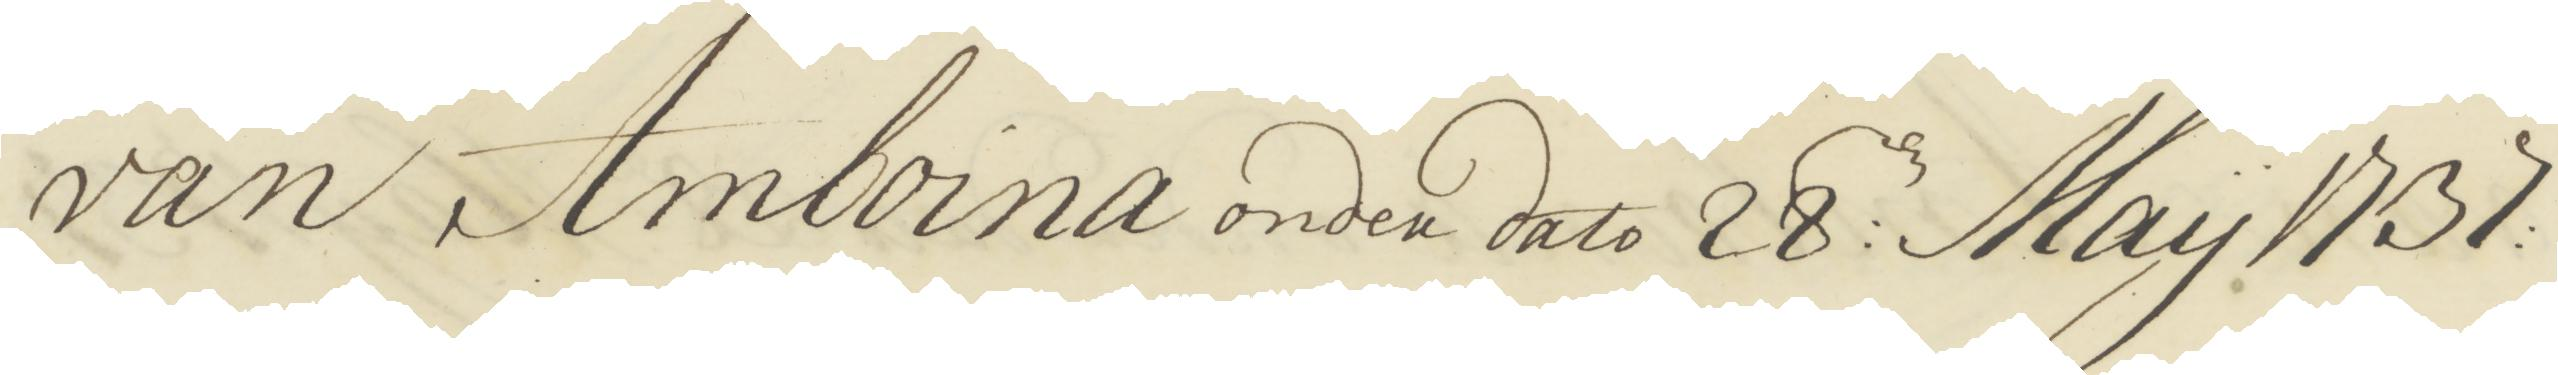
van Amboina onder dato 28:en Maij 1737:
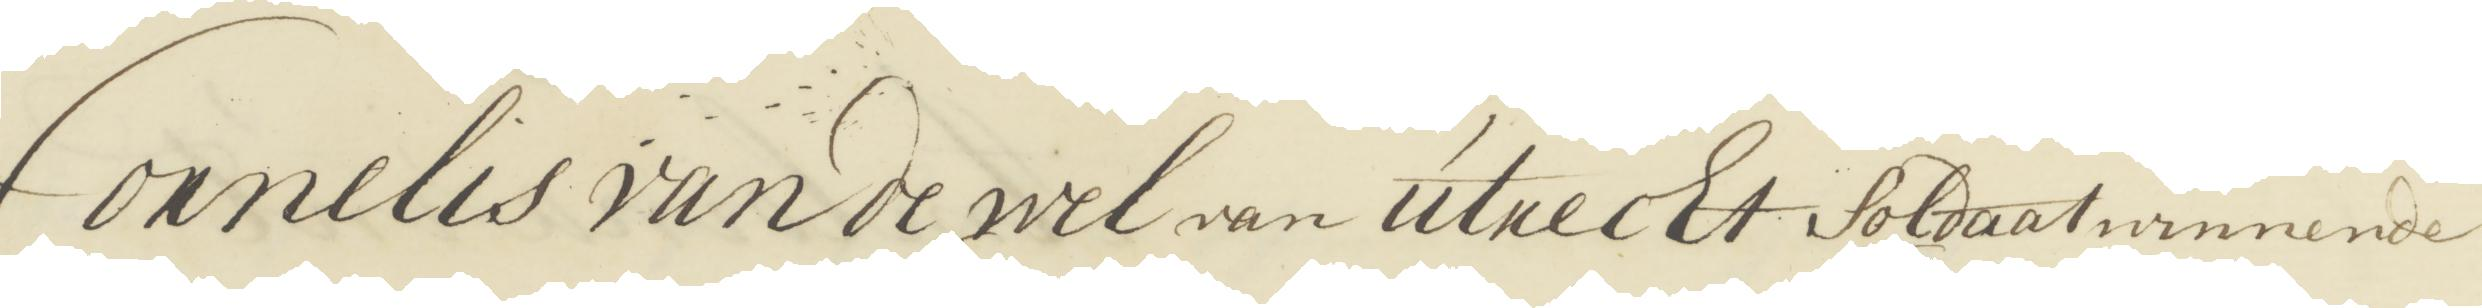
Cornelis van de wel van utrecht soldaat winnende
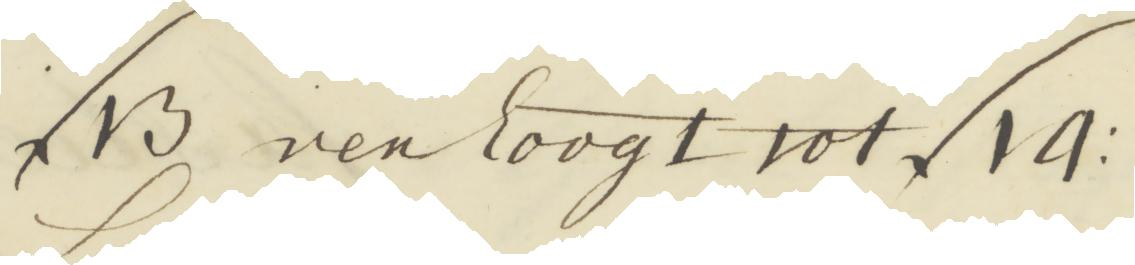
ƒ13 verhoogt tot ƒ14:
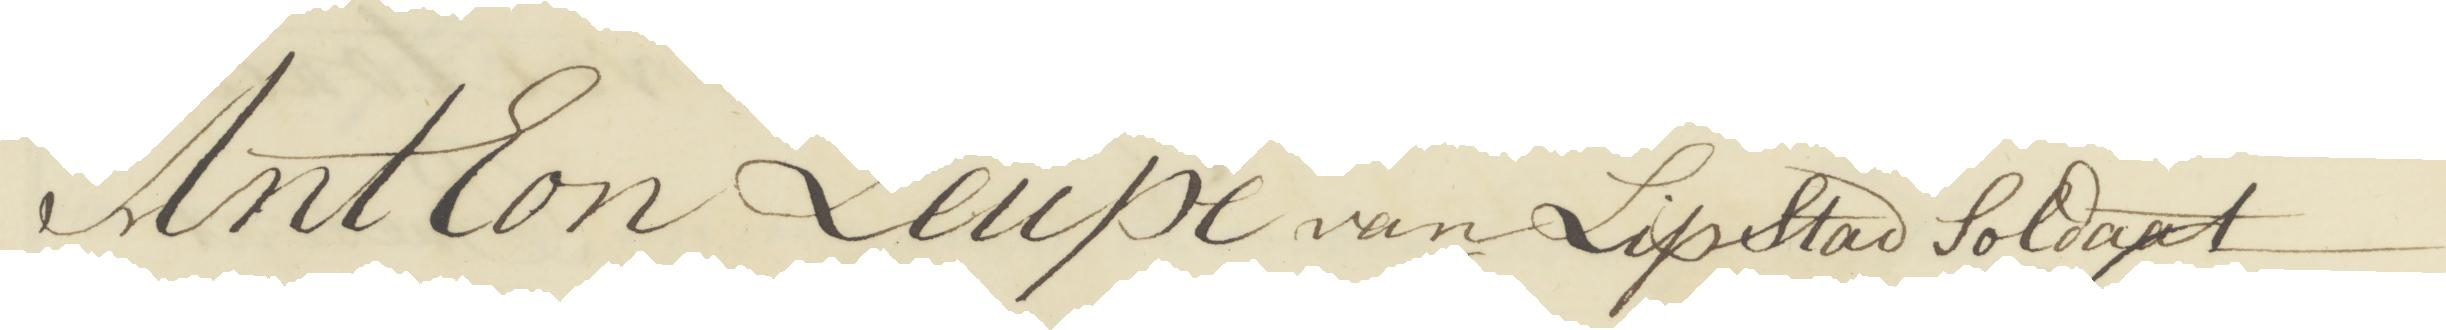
Anthon Leupe van Lipstad soldaat
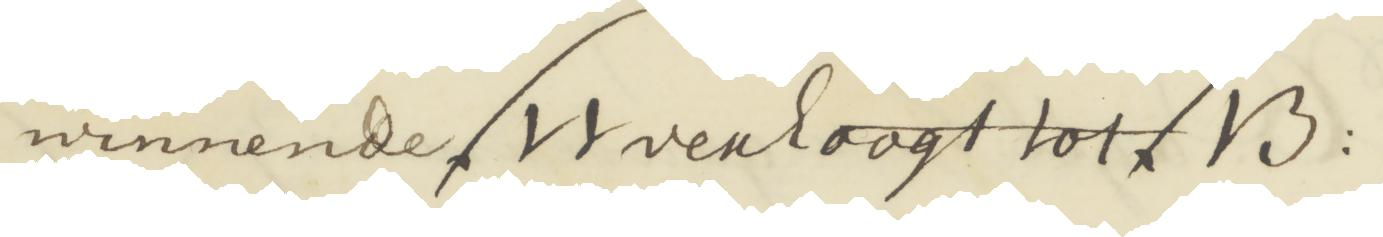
winnende ƒ11 verhoogt tot ƒ13:
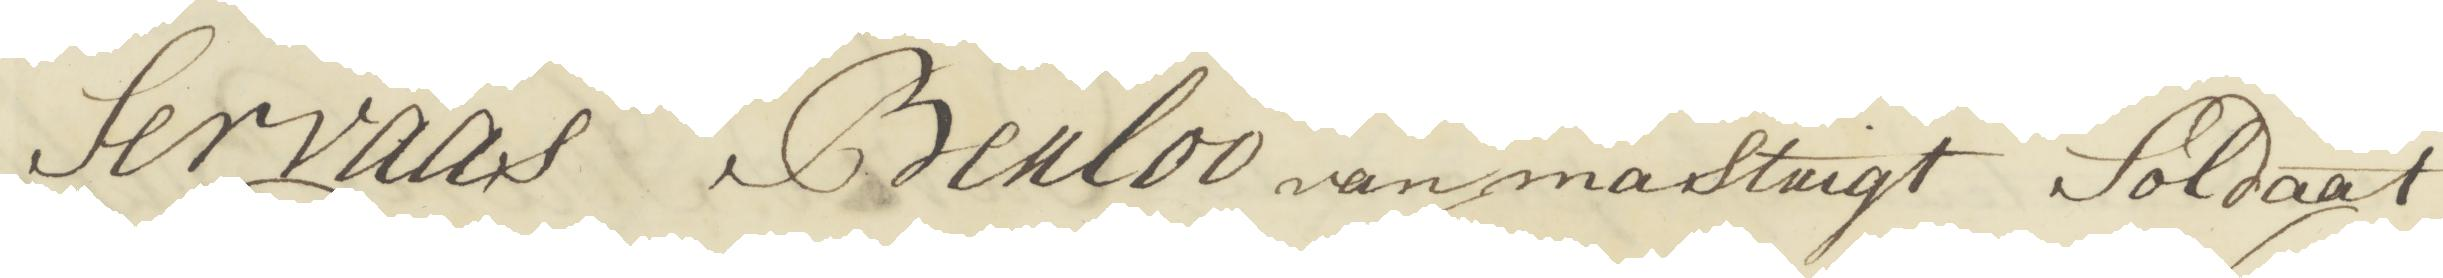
servaas Berloo van mastrigt soldaat
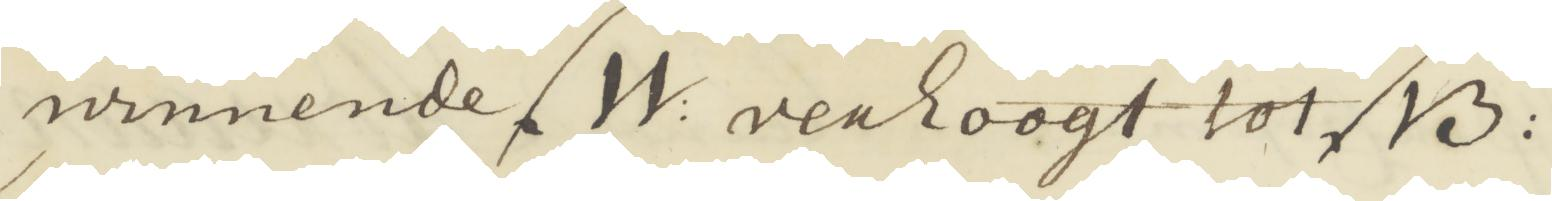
winnende ƒ11: verhoogt tot ƒ13:
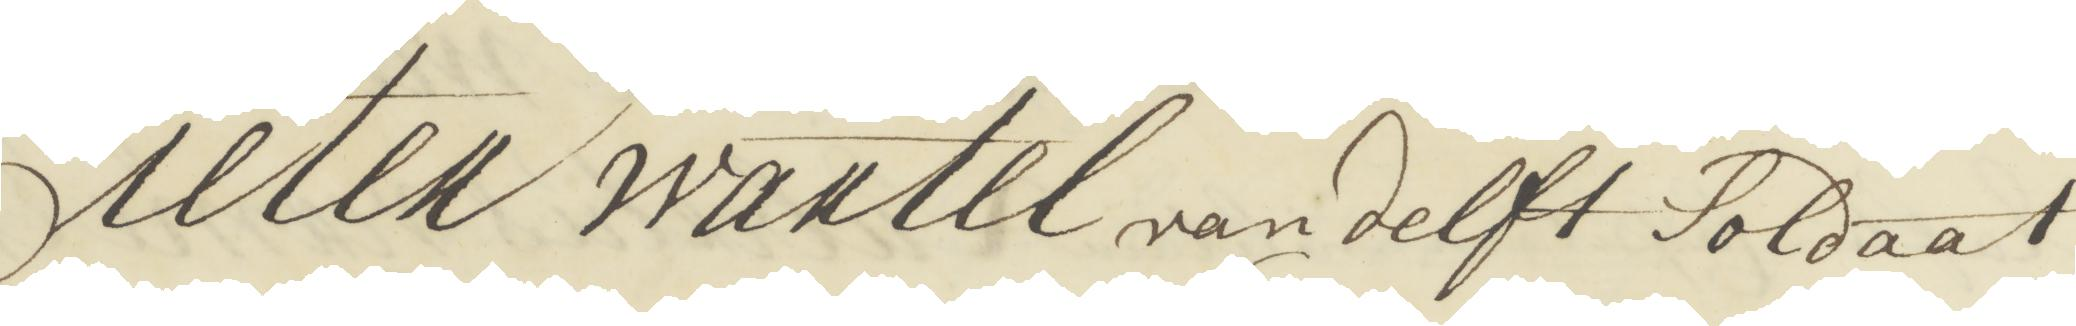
Pieter wartel van delft soldaat
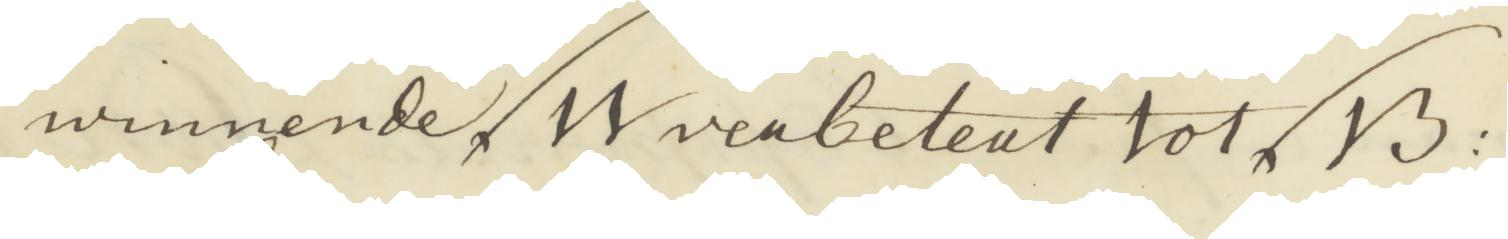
winnende ƒ11 verbetert tot ƒ13:
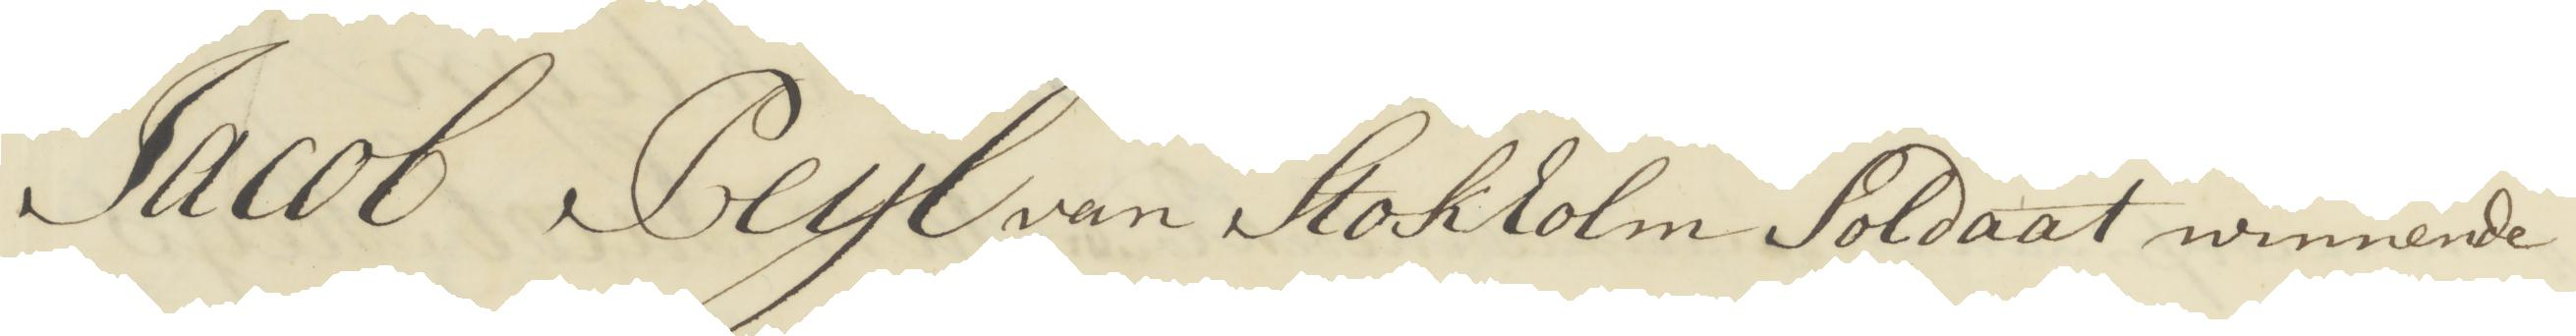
Jacob Peijl van stokholm soldaat winnende
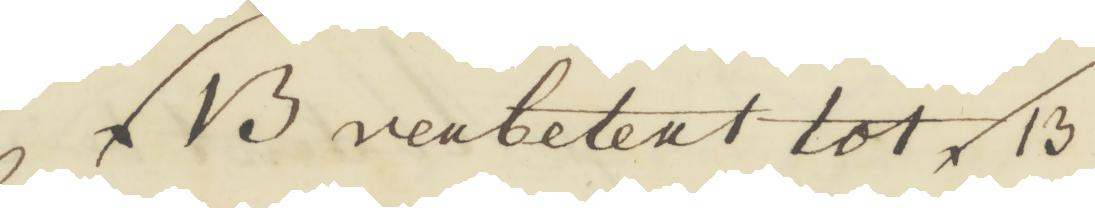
ƒ13 verbetert tot ƒ13
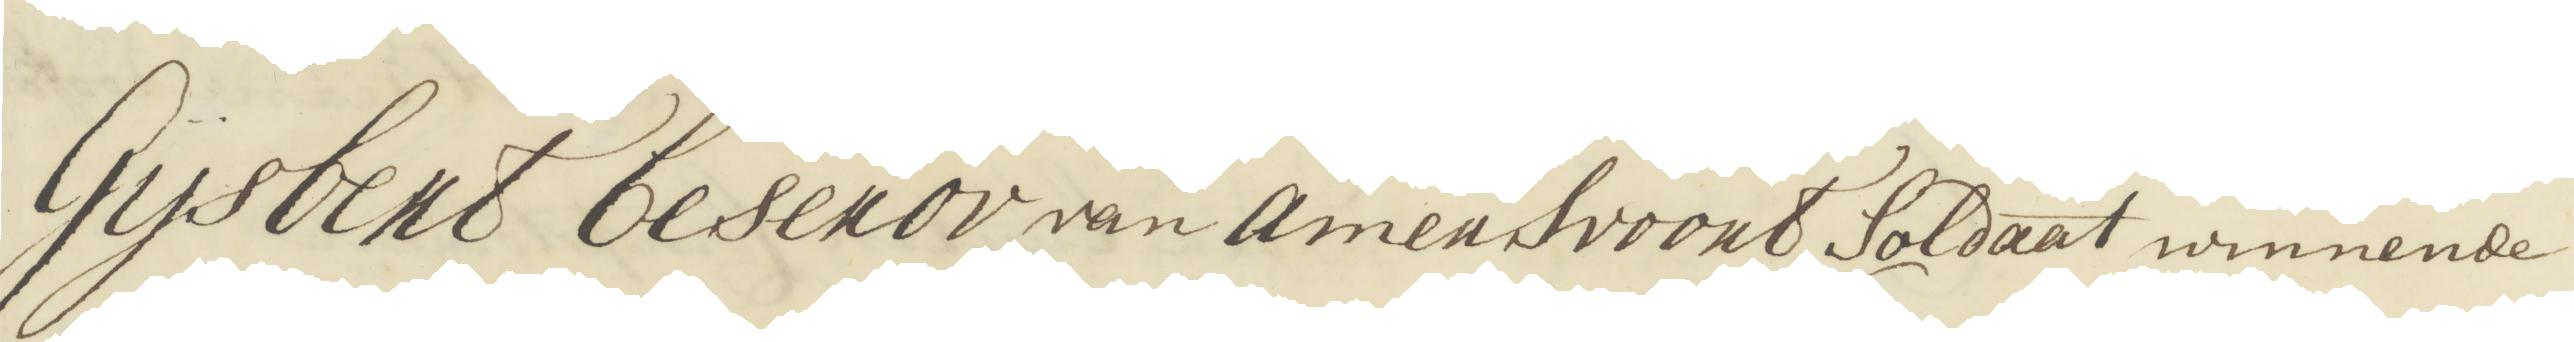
Gijsbert beserov van amersvoort soldaat winnende
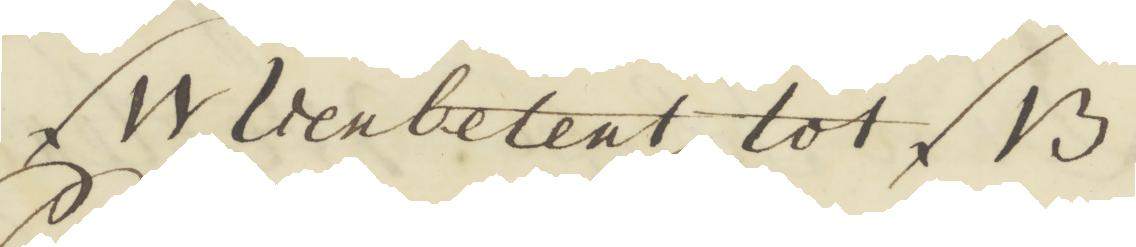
ƒ11 verbetert tot ƒ13
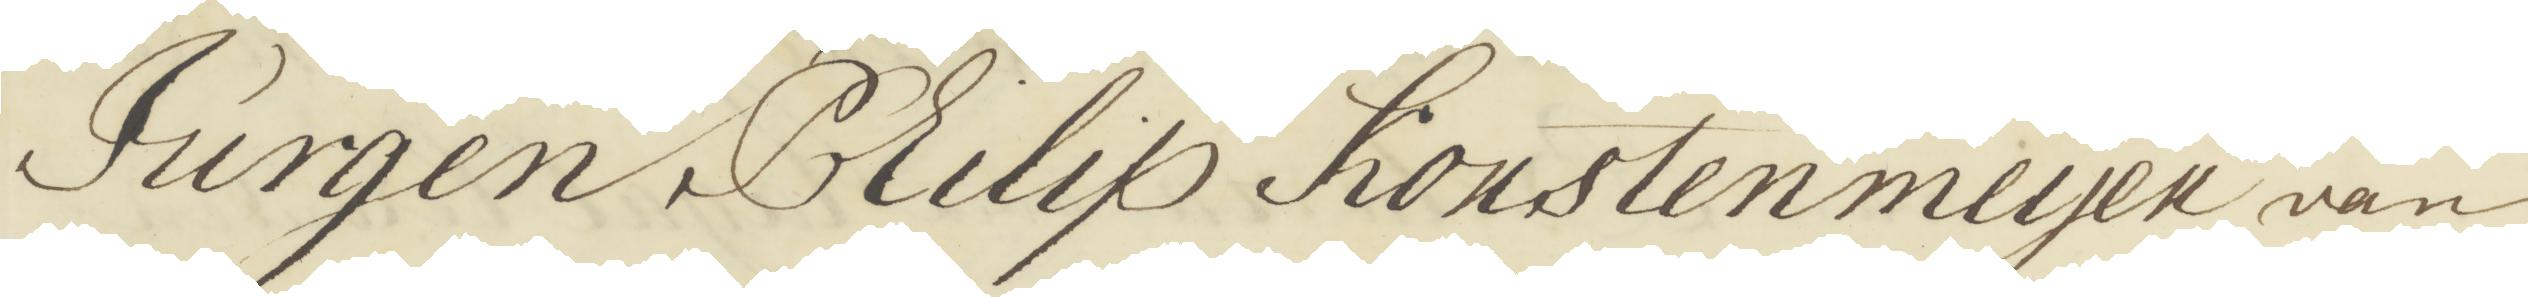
Jurgen Philip korstenmeijer van
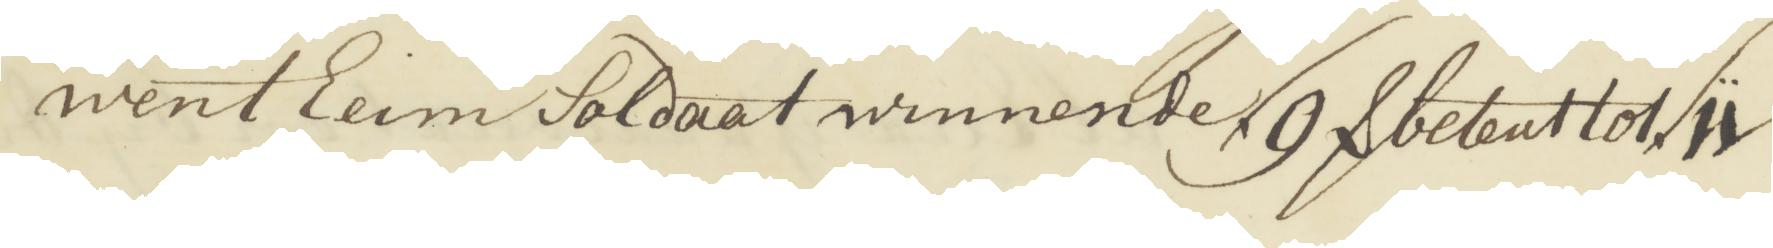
wentheim soldaat winnende ƒ9 verbetert tot ƒ11
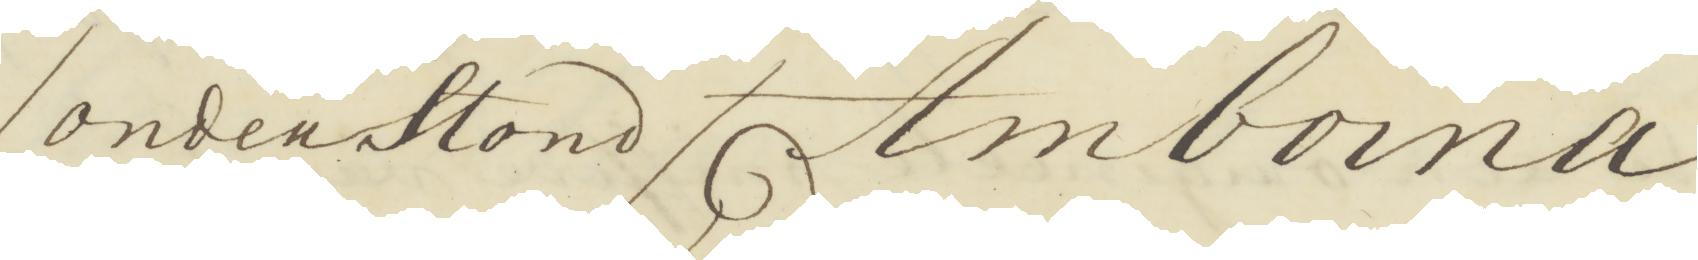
/onderstond/ Amboina
